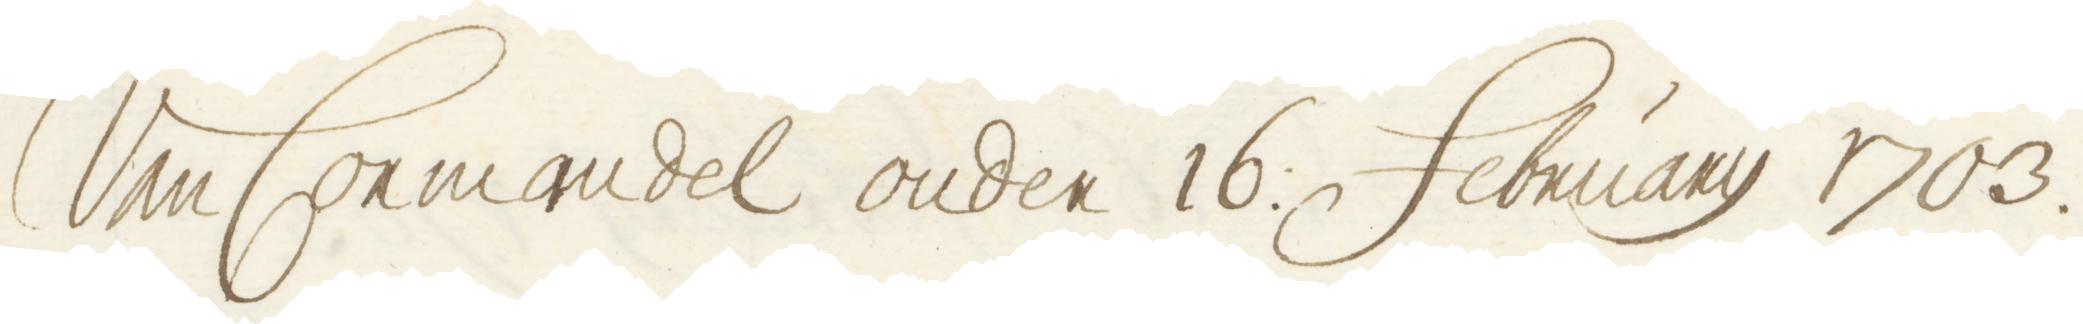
Van Cormandel onder 16: Februarij 1703.
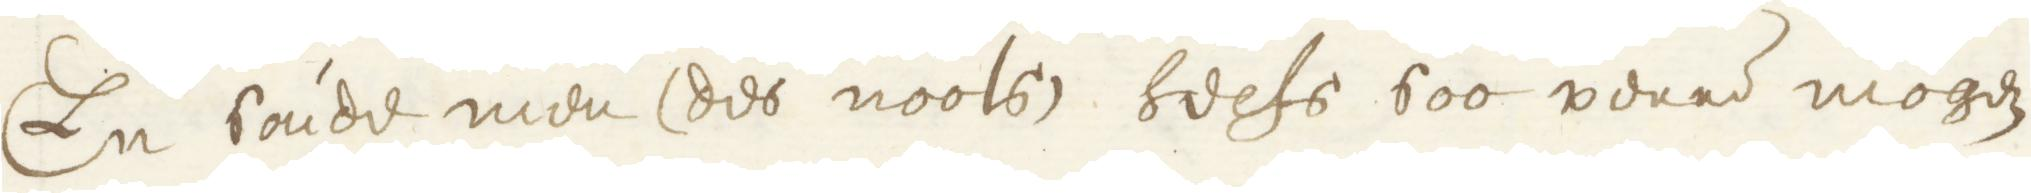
En soude men (des noots) selfs soo verre mogen
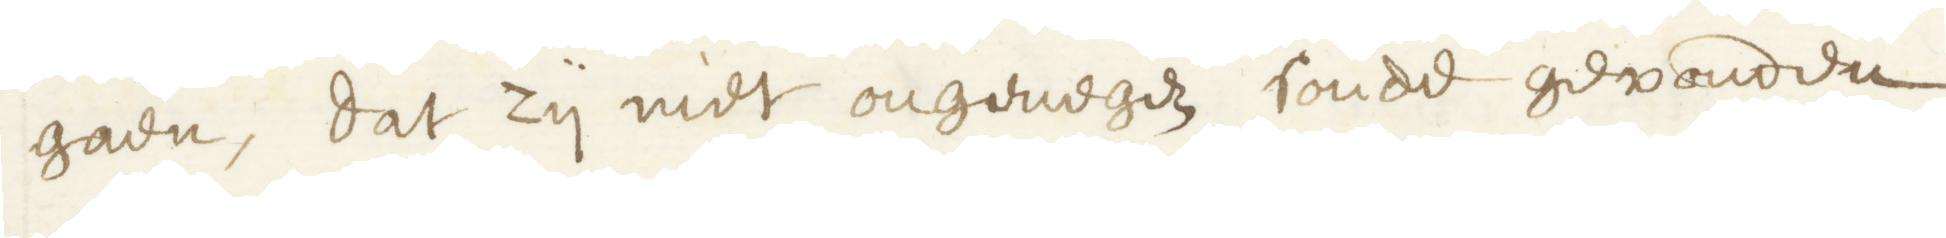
gaen, dat zij niet ongenegen soude gevonden
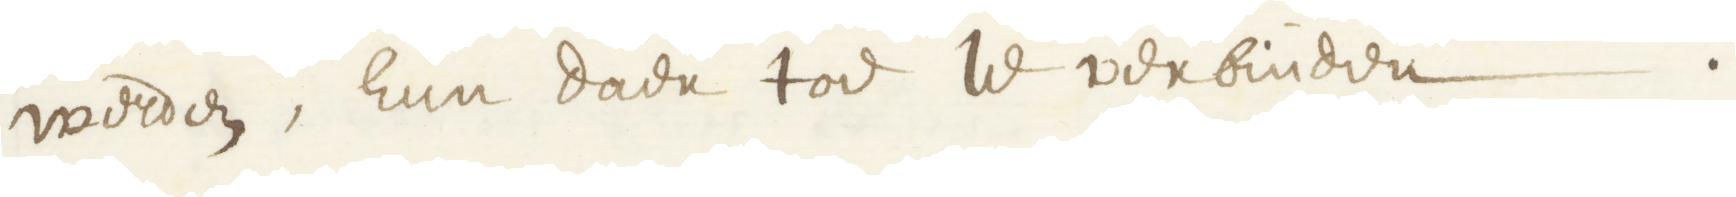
werden, hun daer toe te verbinden.
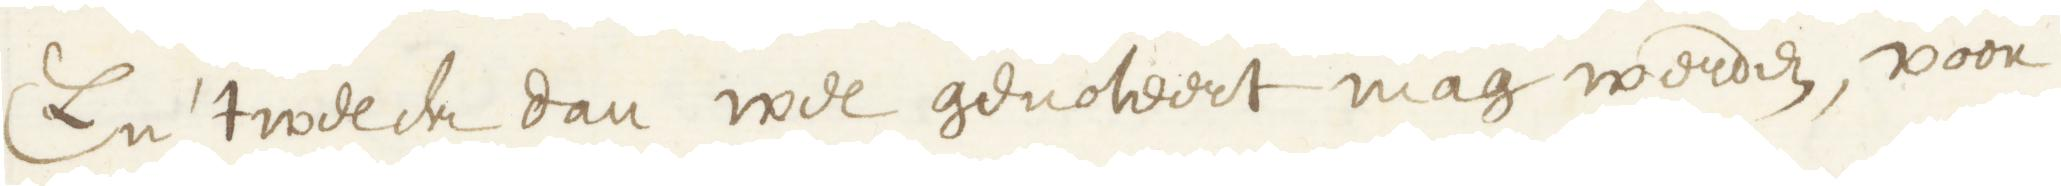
En 't welck dan wel genoteert mag werden, voor
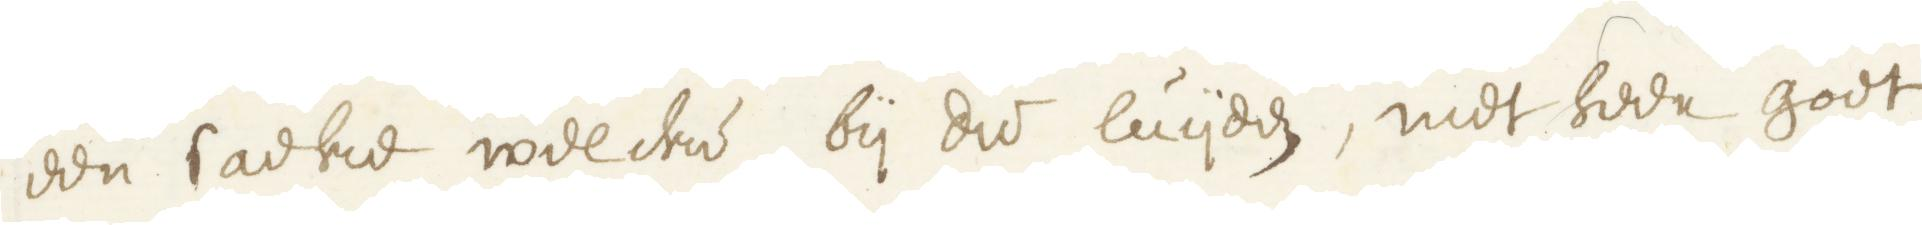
een saeke welcke bij die luijden, met seer goet
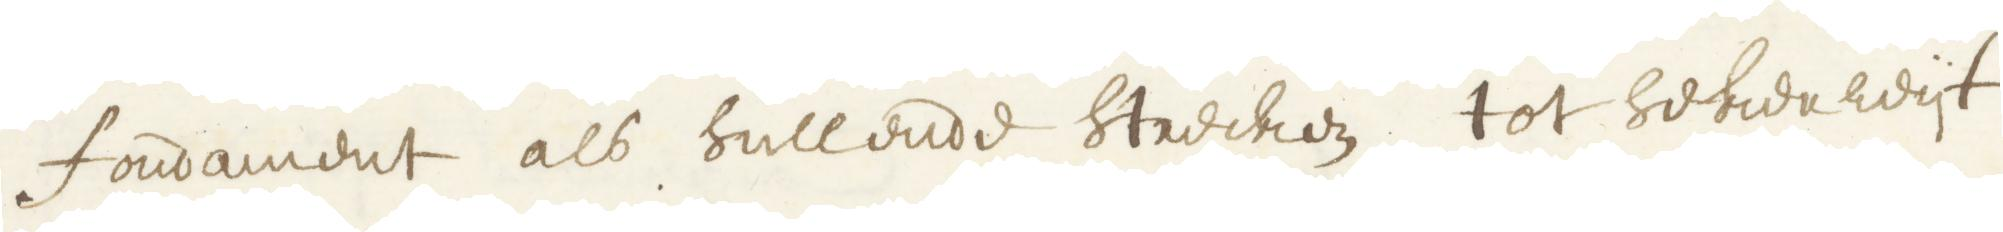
fondament als sullende strecken tot sekerheijt
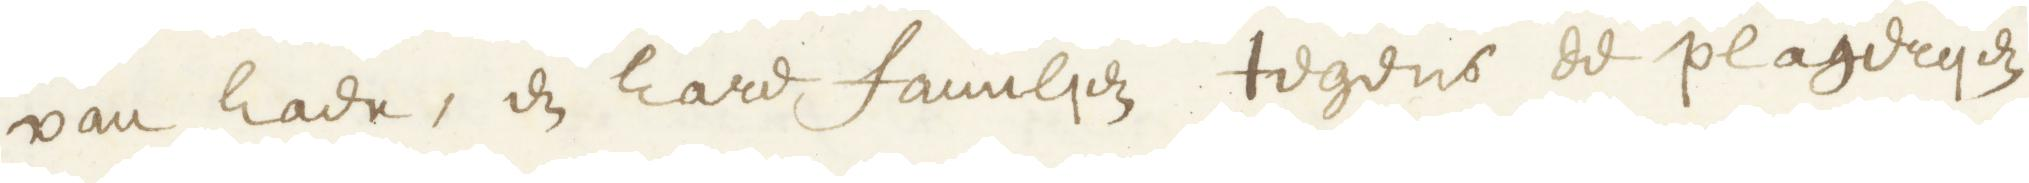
van haer, en hare familien tegens de plagerijen
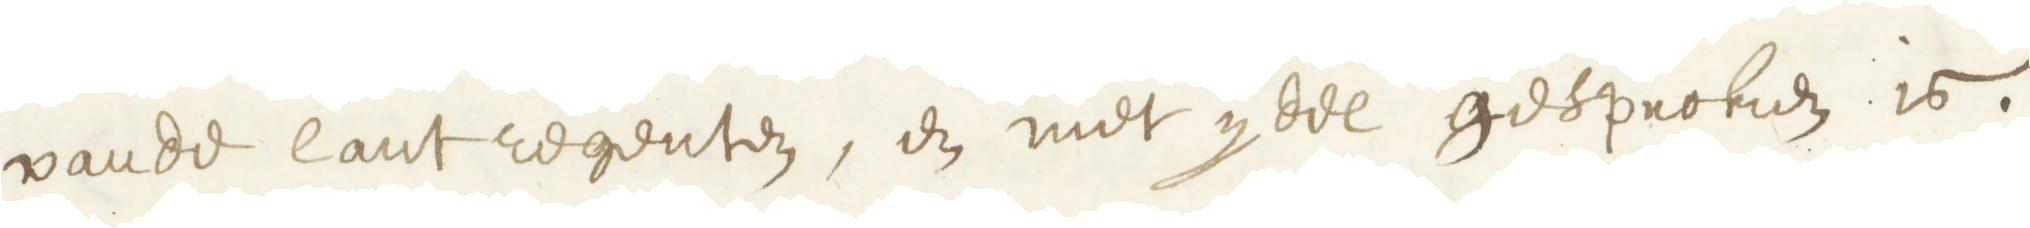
vande lant regenten, en niet ijdel gesproken is.
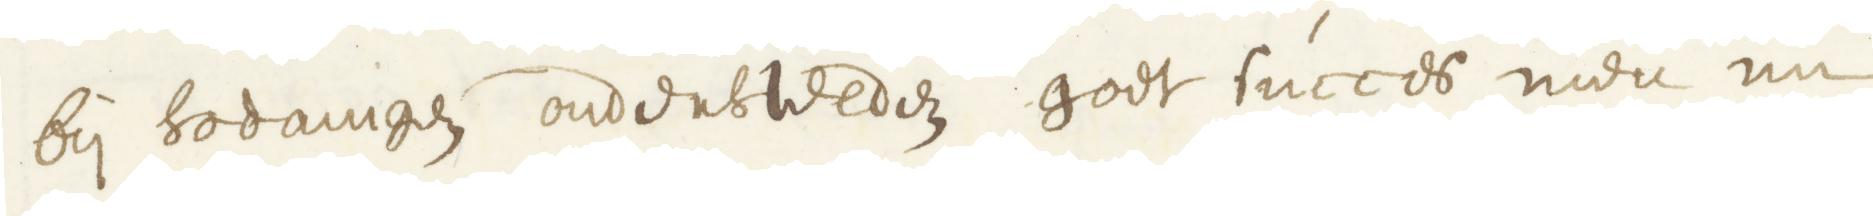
bij sodanigen onderstelden goet succes men nu
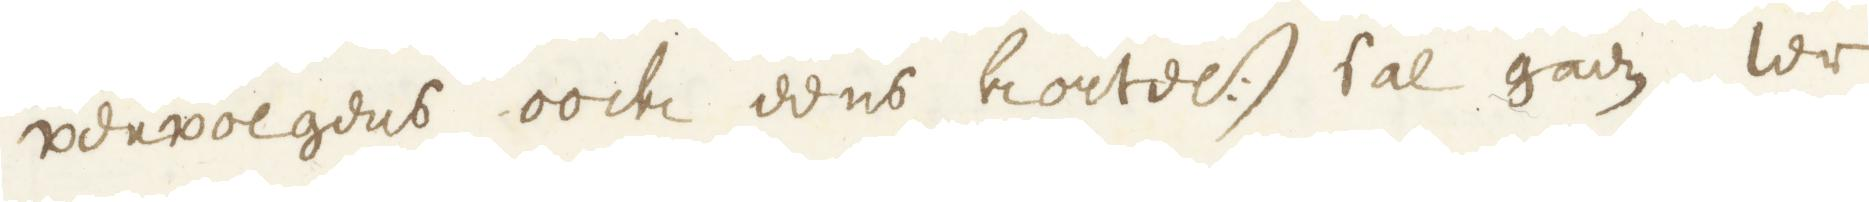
vervolgens oock eens kortelijk sal gaen ter
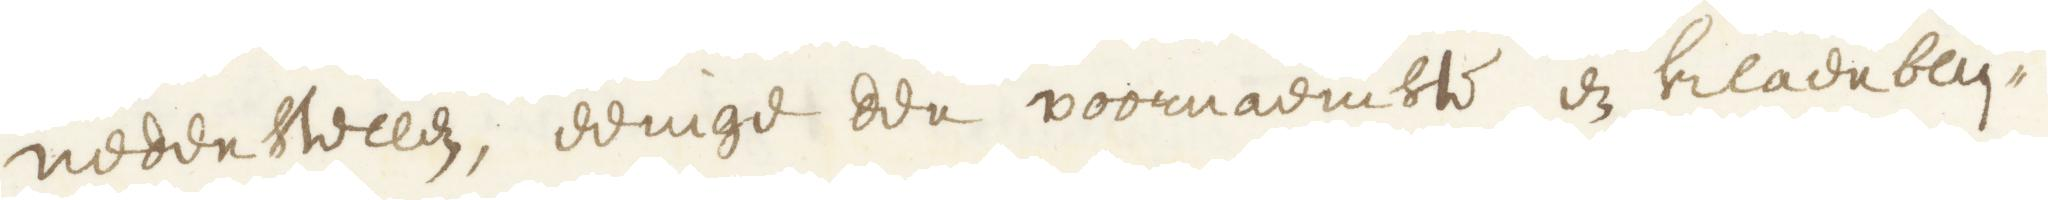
nederstellen, eenige der voornaemste en klaer blij„
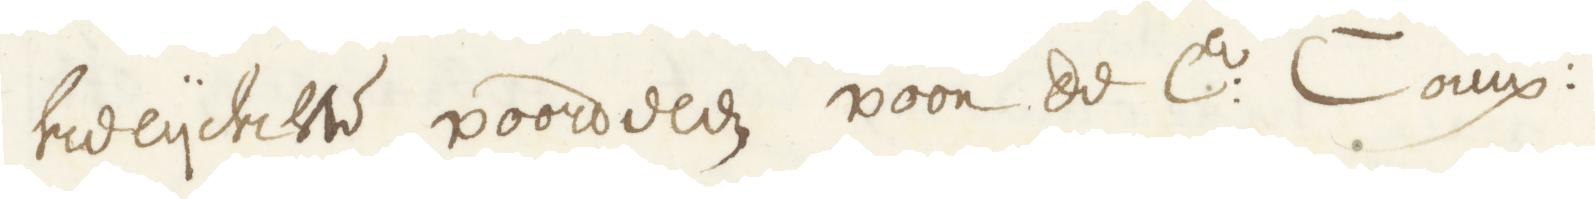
kelijckste voordelen voor de E: Comp:'
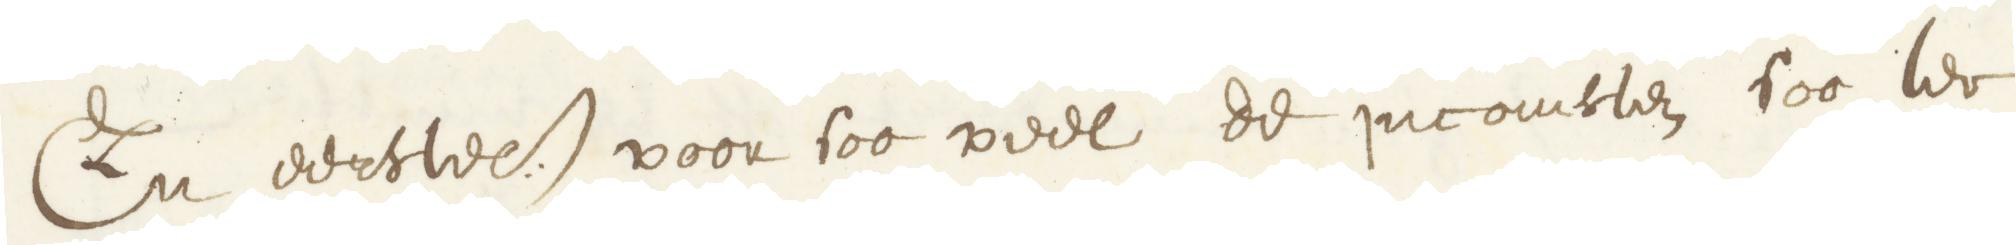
En eerstelijk voor soo veel de jncomsten soo ter
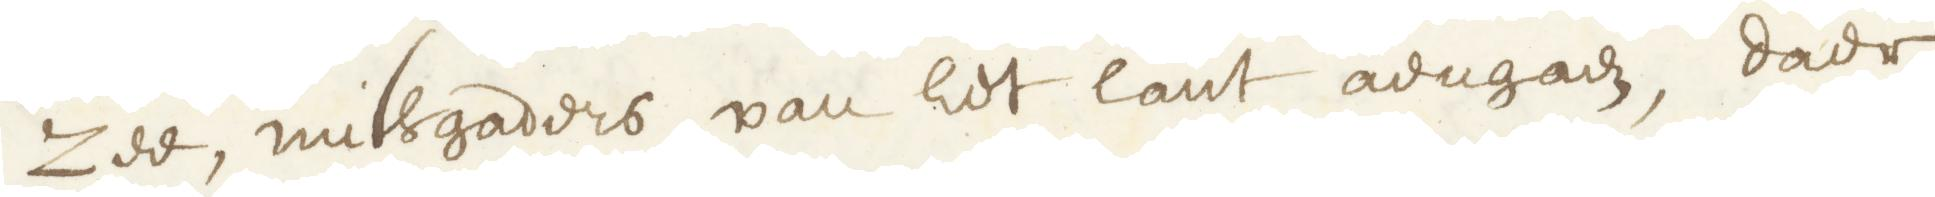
zee, mitsgaders van het lant aengaen, daer
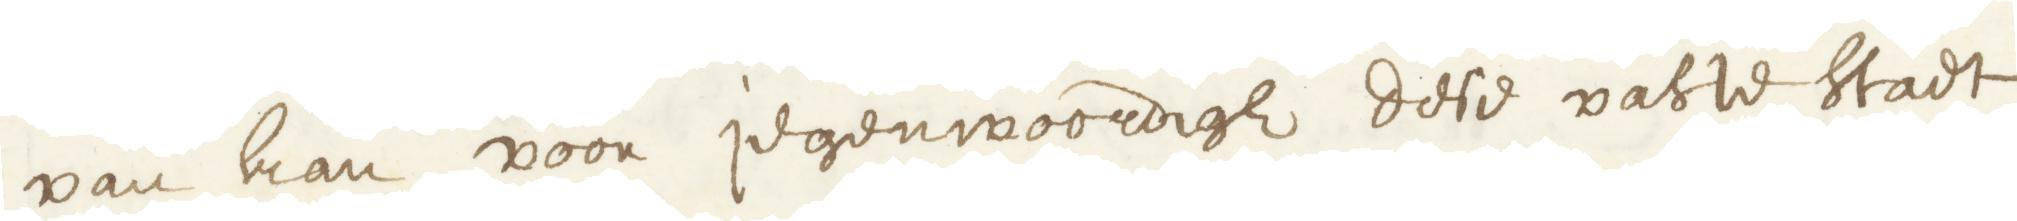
van kan voor jegenwoordigh dese vaste staet
